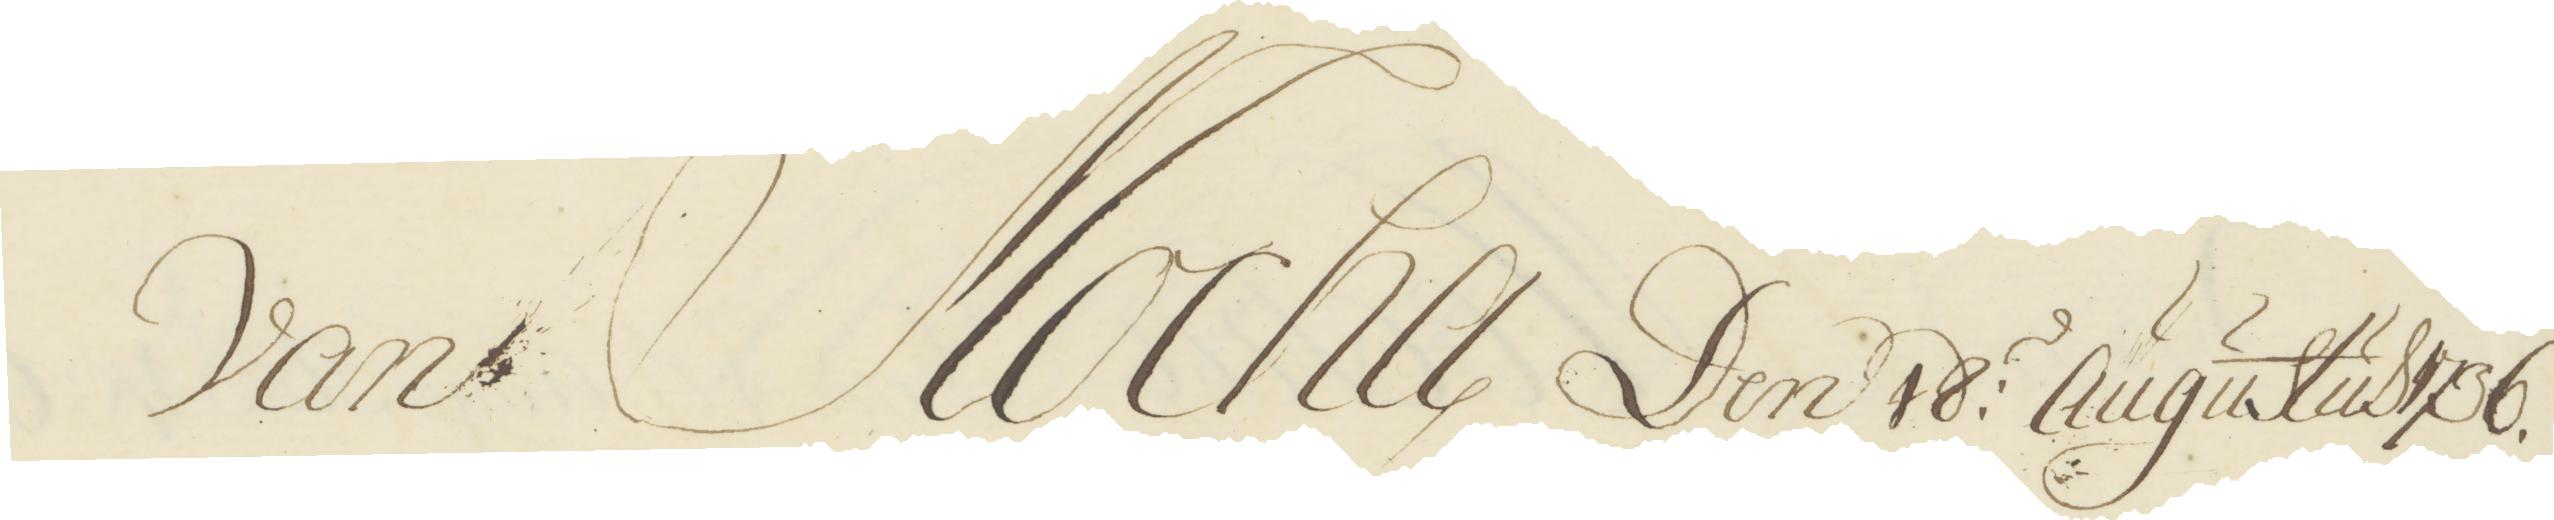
Van Mocha Den 18:e Augustus 1736.
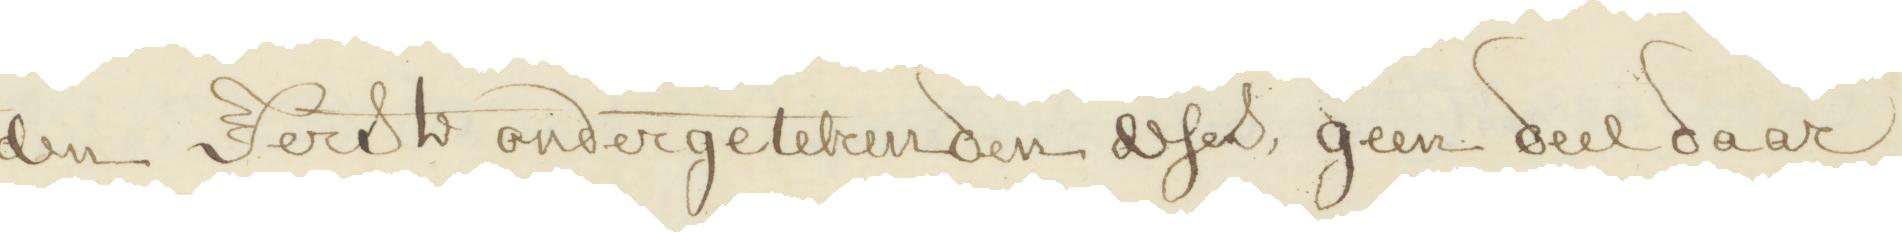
den Eerste ondergetekenden deses, geen deel daar
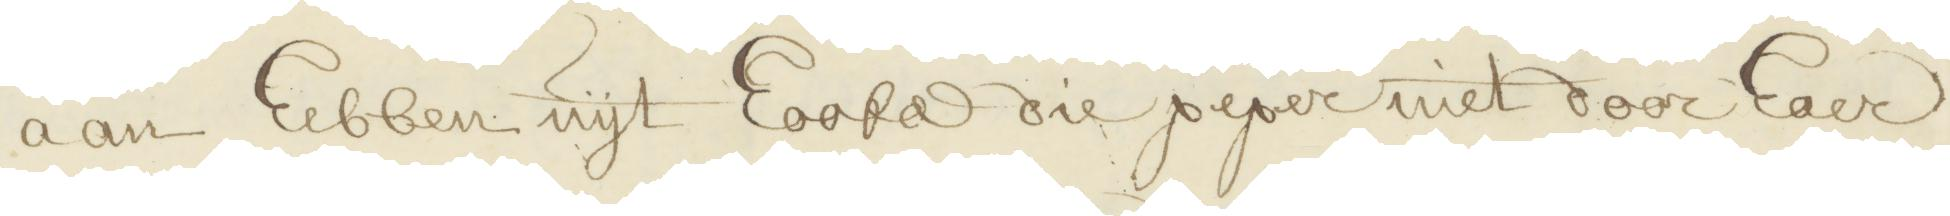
aan hebben uijt hoofde die peper niet door haer
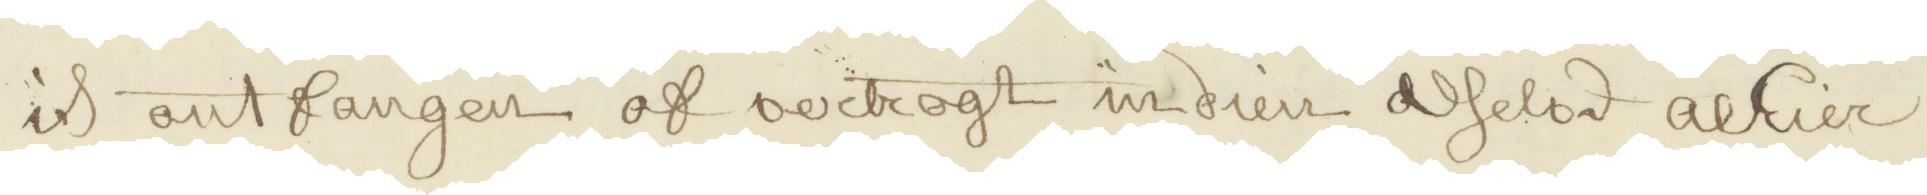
is ontfangen of verkogt in dien deselve alhier
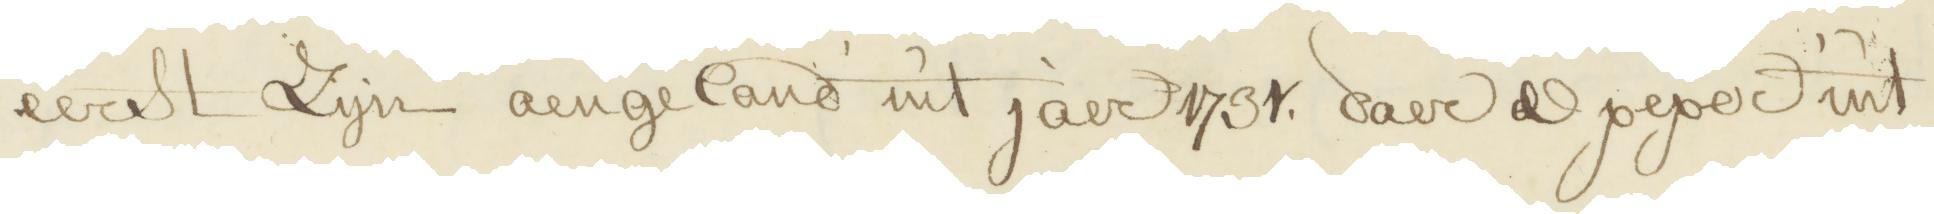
eerst zijn aengeland in't jaer 1731. daer de peper in't
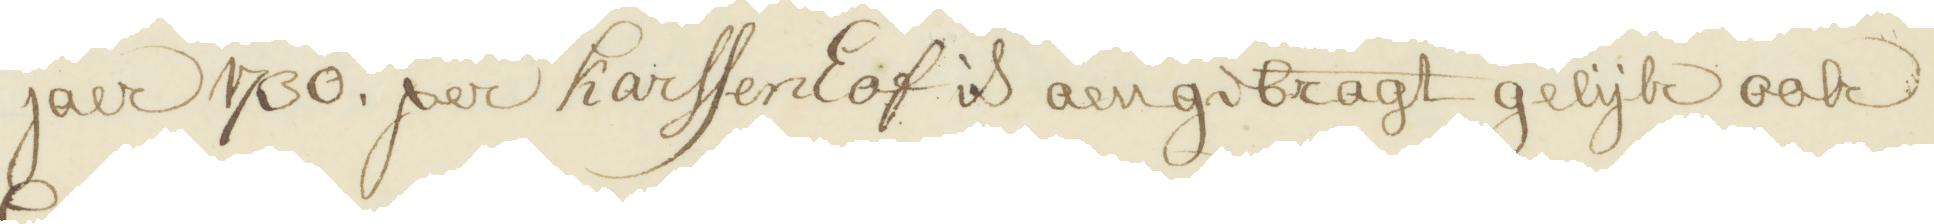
jaer 1730. per karssenhof is aengebragt gelijk ook
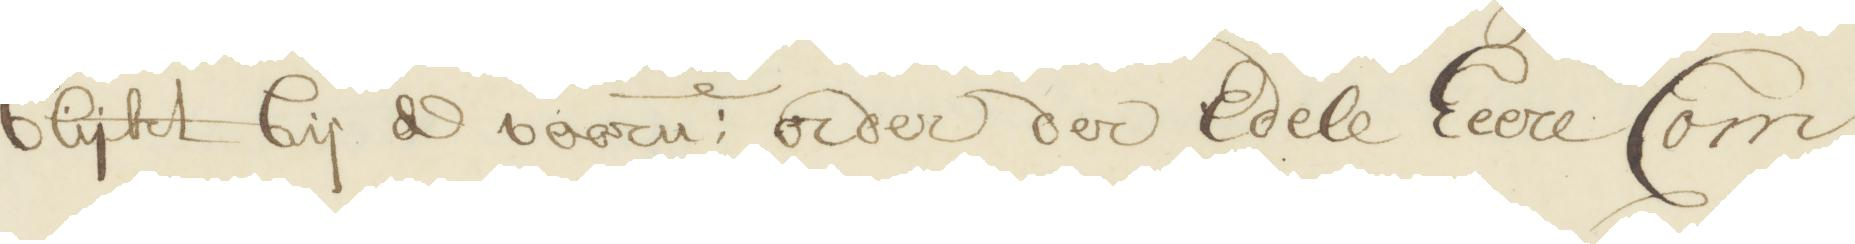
blijkt bij de voorn: order der Edele heere Com
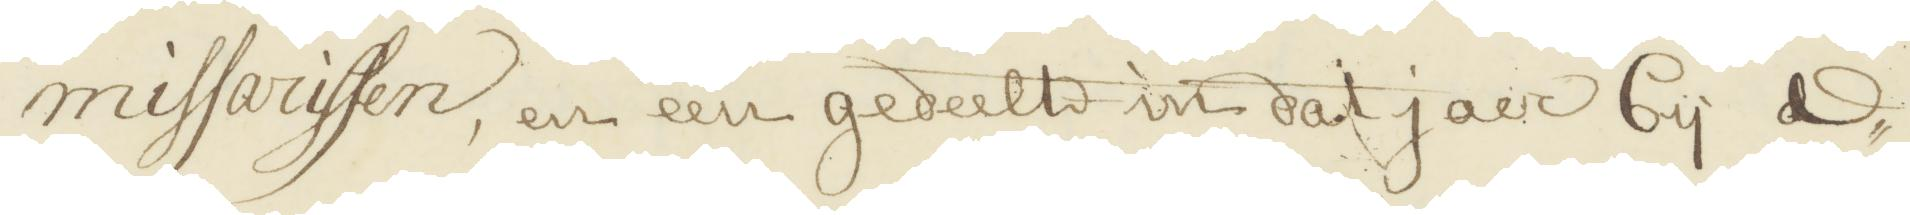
missarissen, en een gedeelte in dat jaer bij de„
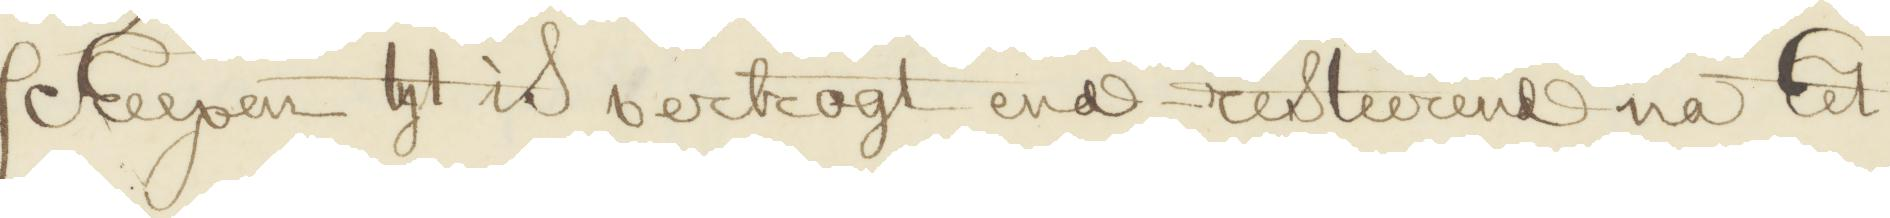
scheepen tyt is verkogt ende resteerende na het
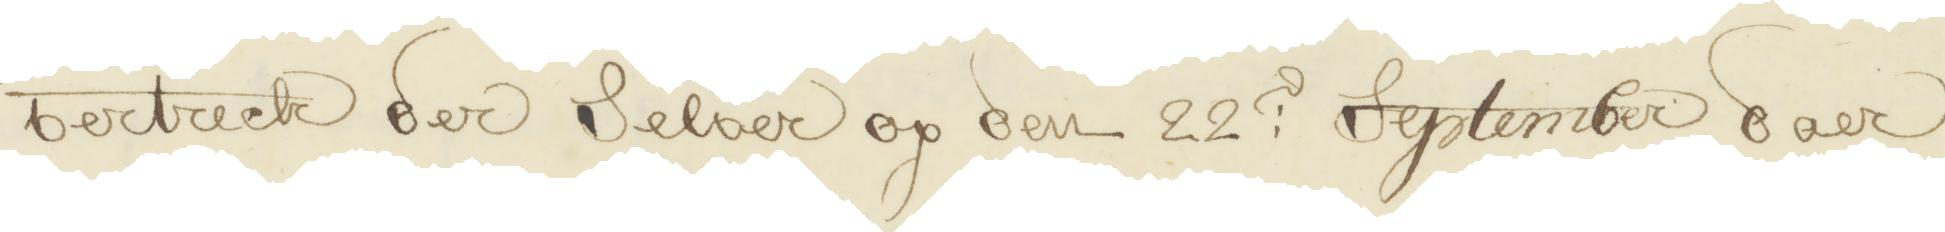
vertreck der selver op den 22:e september daer
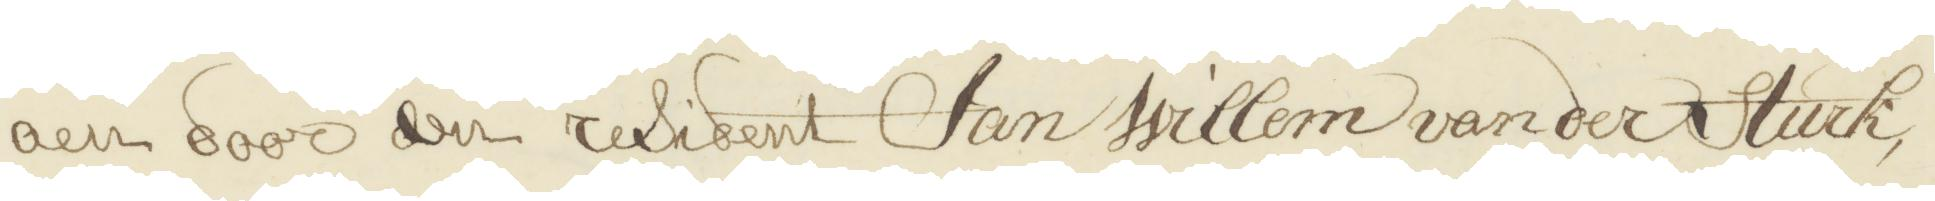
aen door den resident Ian Willem van der sturk,
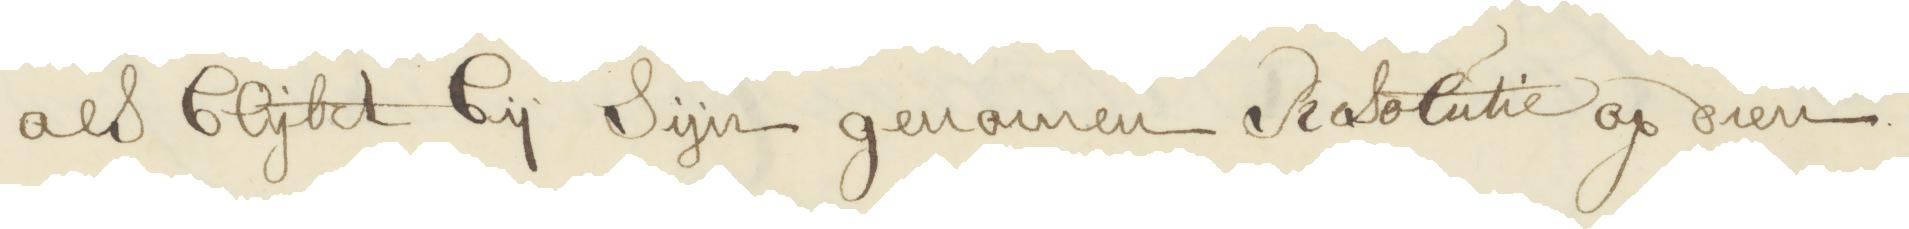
als blijkt bij sijn genomen Resolutie op dien
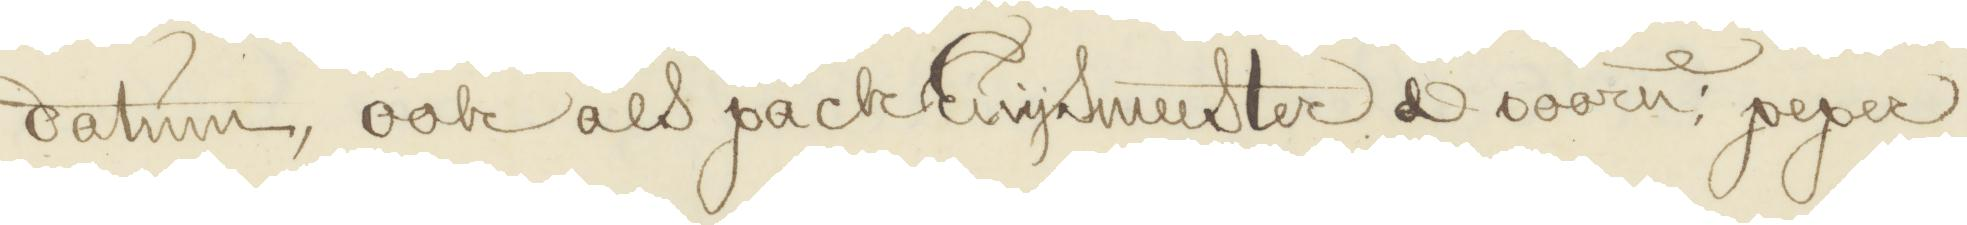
datum, ook als packhuijsmeester de voorn: peper
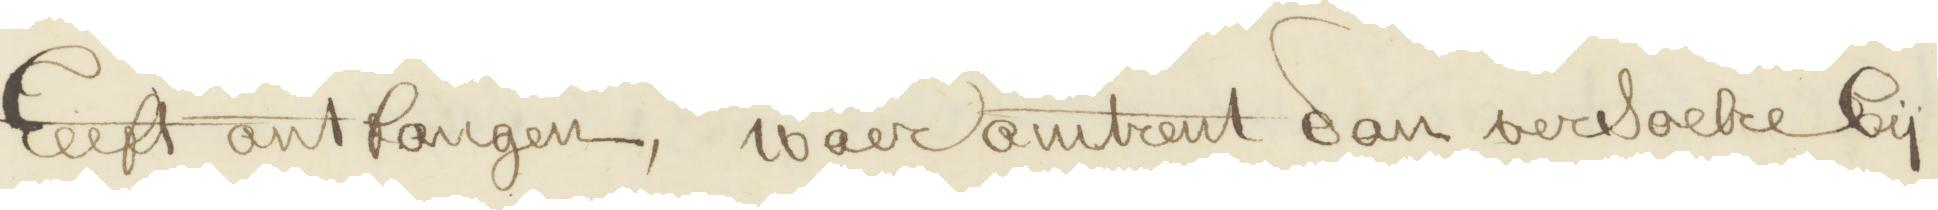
heeft ontfangen, waer omtrent dan versoeke bij
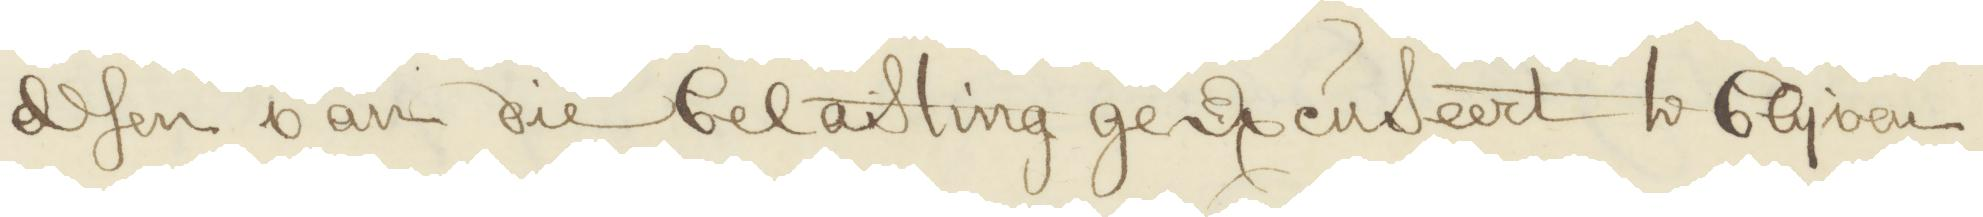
desen van die belasting geExcuseert te blijven
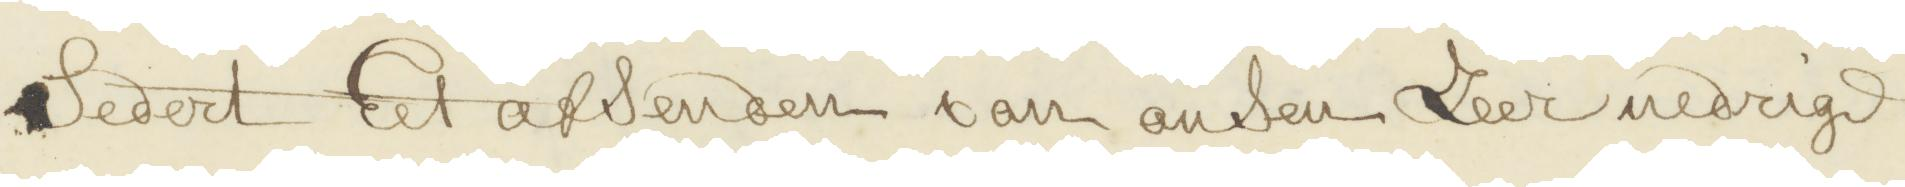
sedert het afsenden van onsen zeer nedrige
